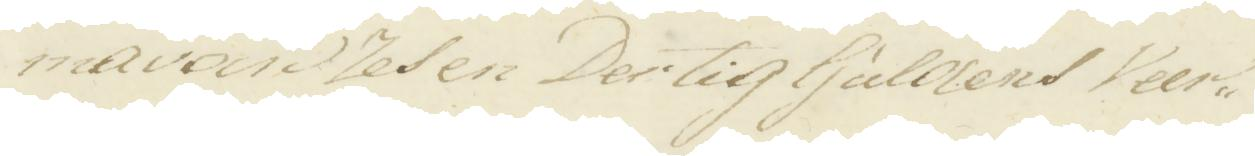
ma van zes en Dertig Guldens Veer„
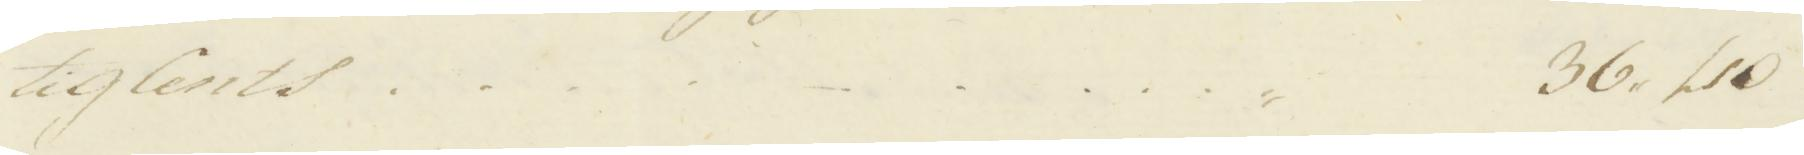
tig Cents . . . . . . . . . „ 36„ 40.
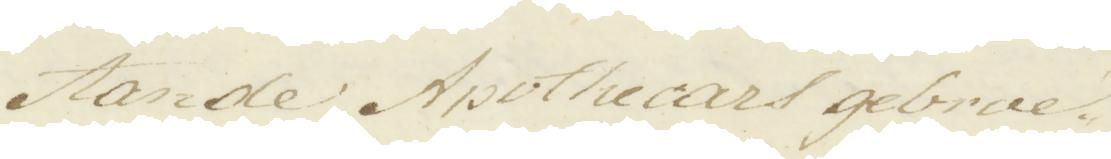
Aan de Apothecars gebroe„
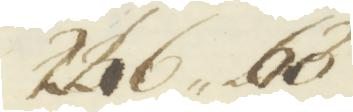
246 „ 68
